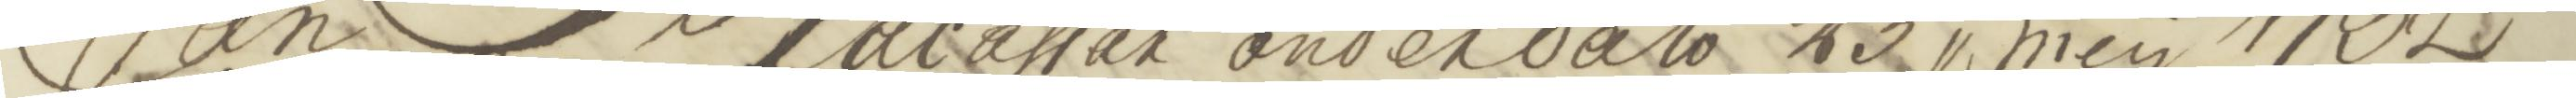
Van Macassar onderdato 23„' Meij 1732
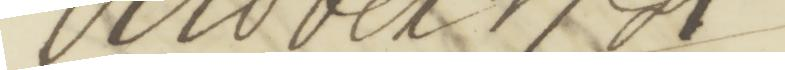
October 1731
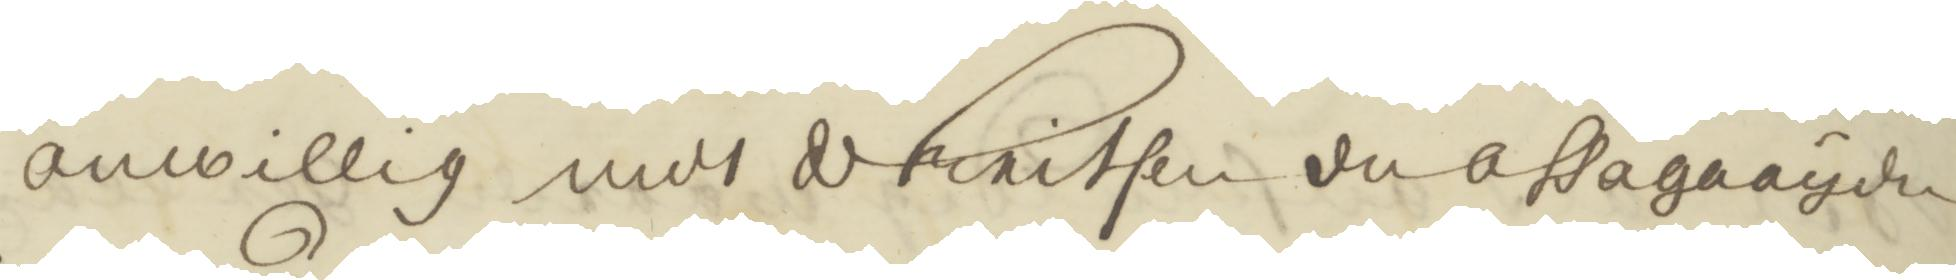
onwillig met de kritsen en assagaaijen
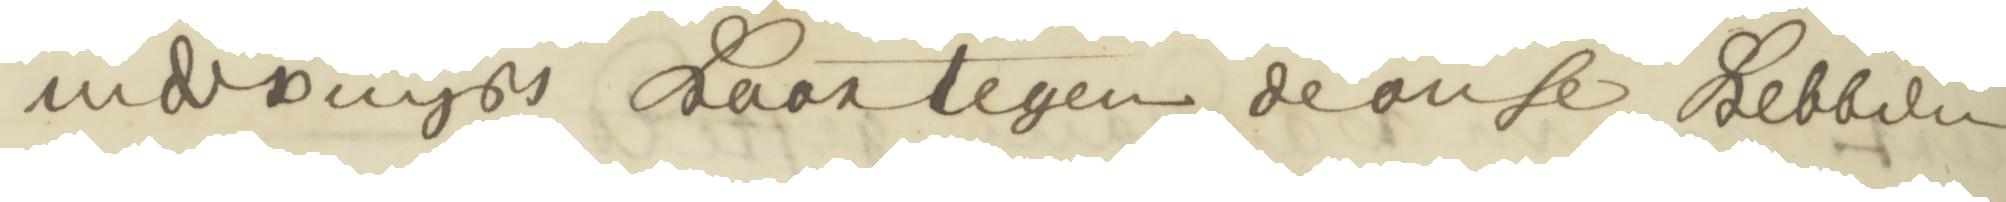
inde vuijst haar tegen de onse hebben
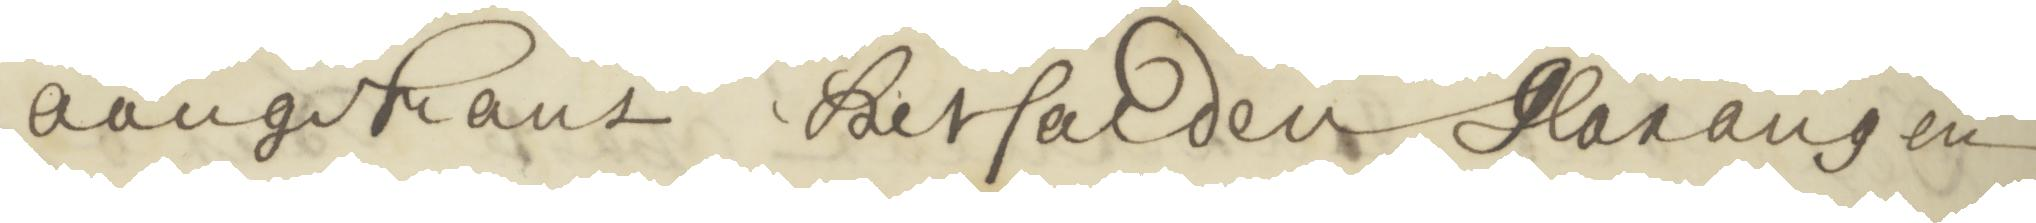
aangekant het sal den glarang en
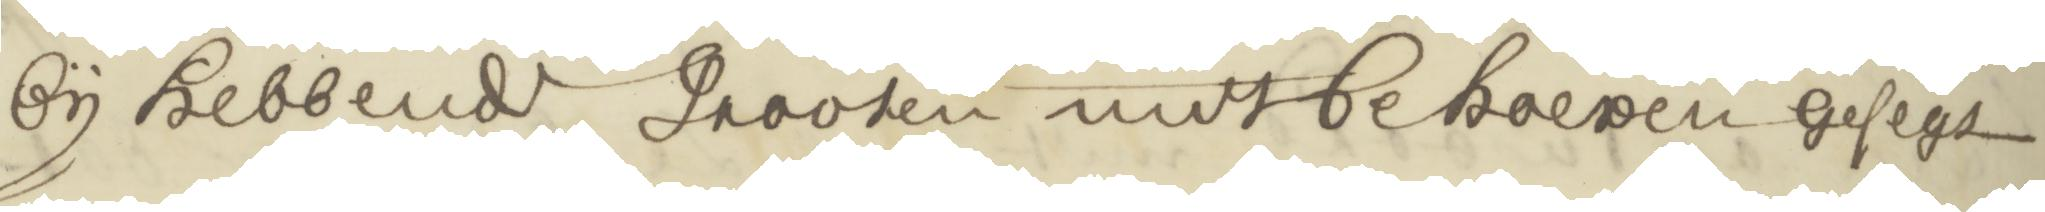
bij hebbende grooten niet behoeven gesegt
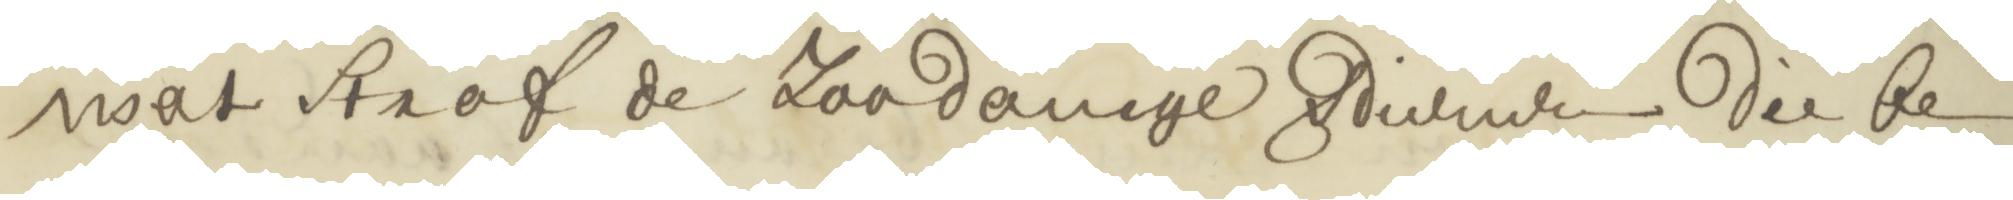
wat straf de zoodanige verdienen die be
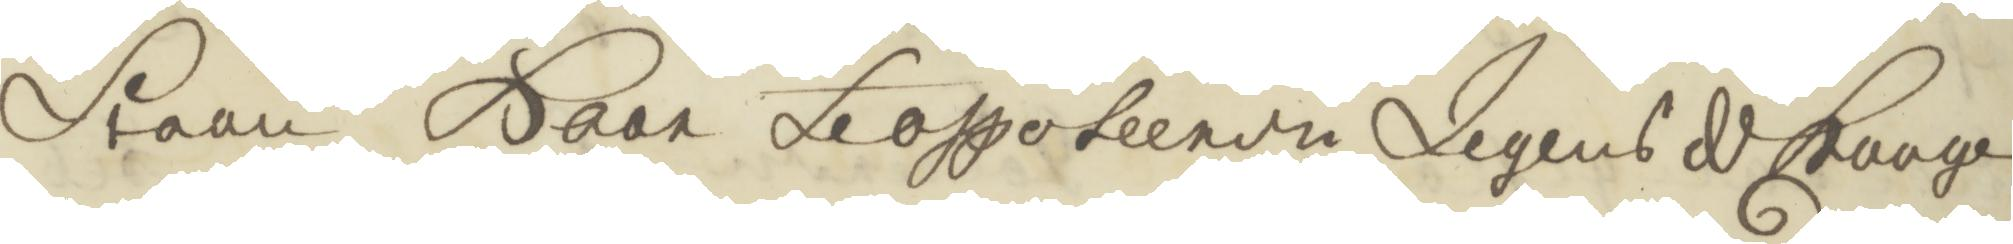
staan haar te opposeeren Iegens de hooge
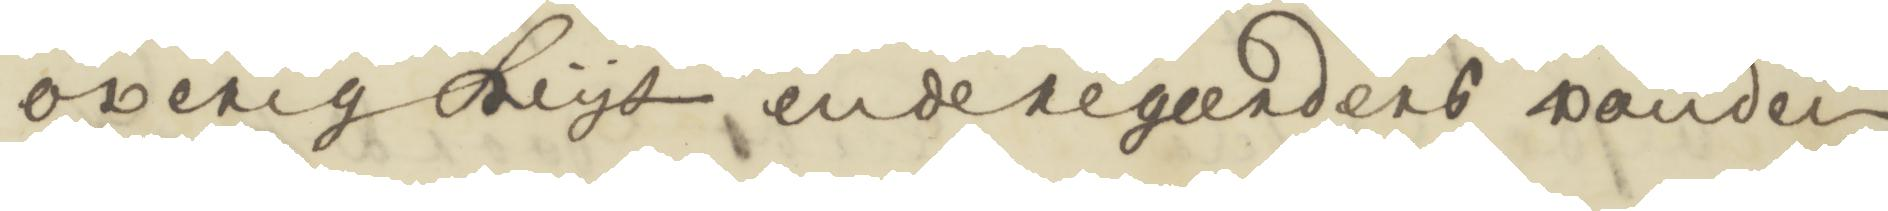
overigheijt ende regeerders vanden
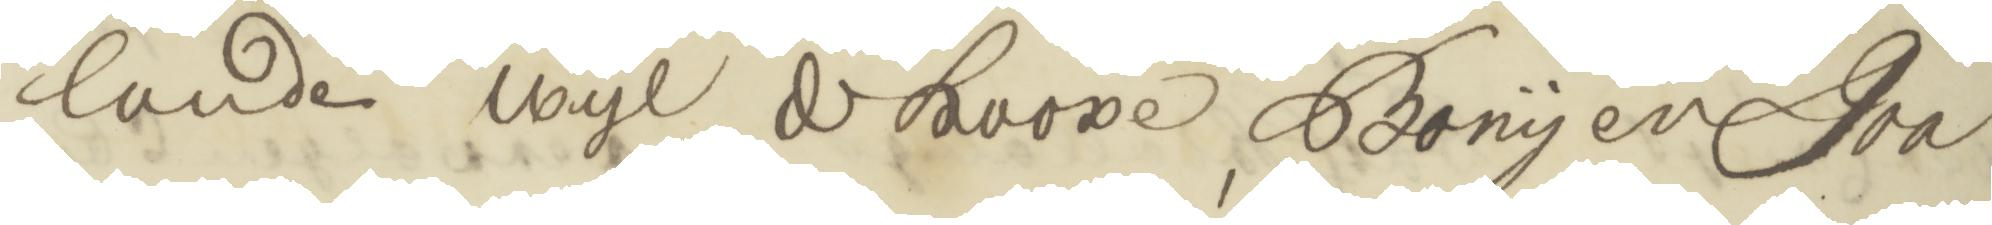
lande wijl de hoove Bonij en Goa
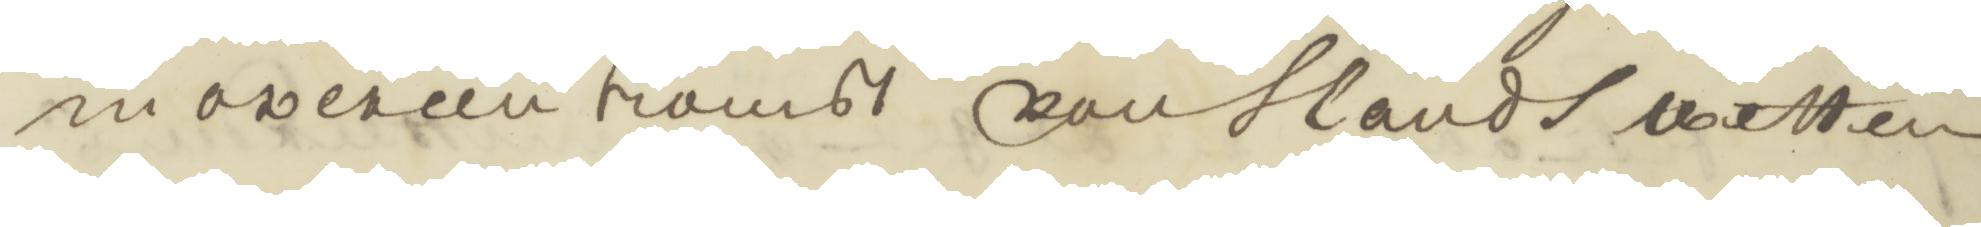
in overeenkomst van 'slands wetten
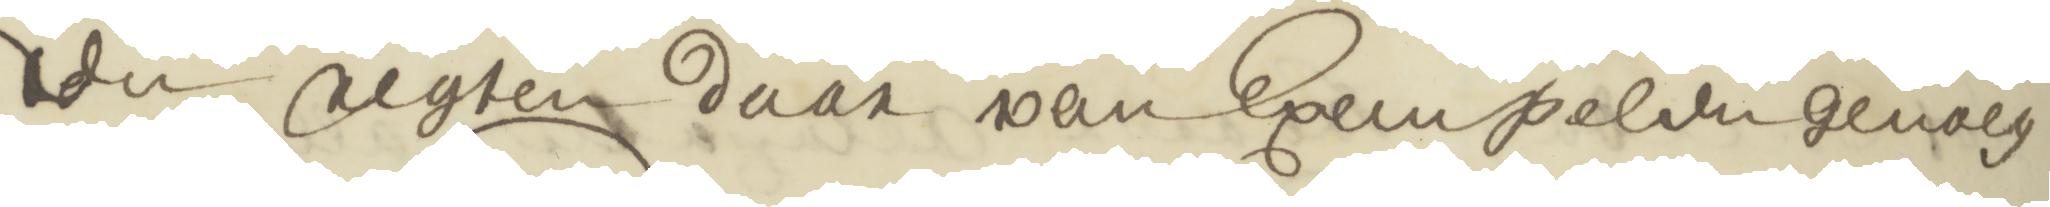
den regten daar van Exempelen genoeg
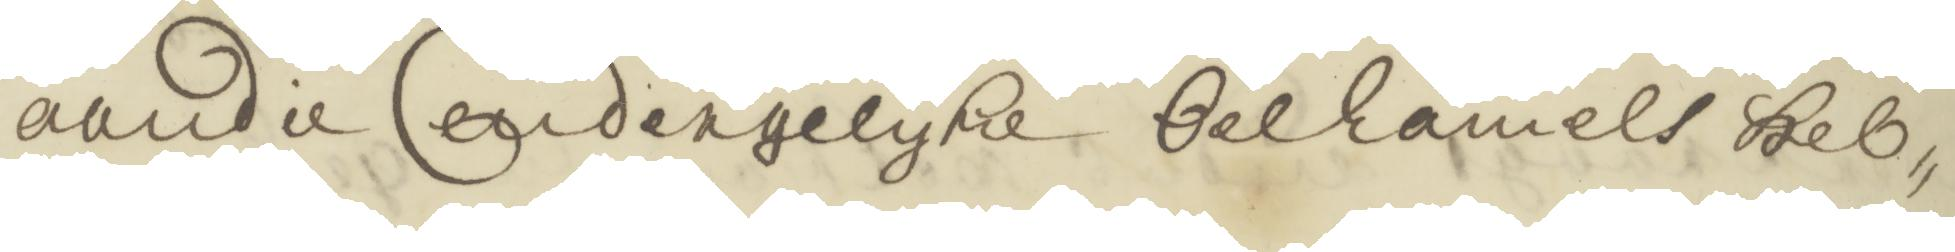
aan die endergelijke belhamels heb„
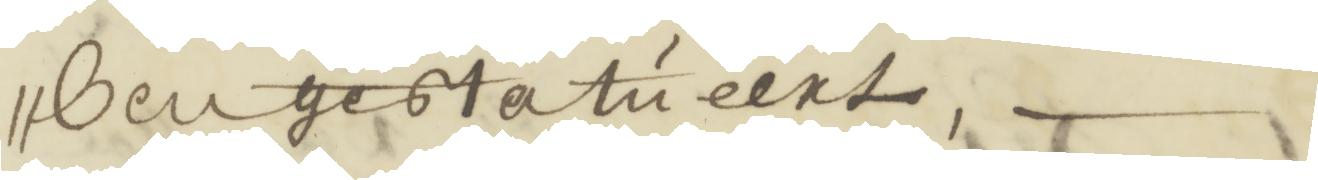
„ben gestatueert, —
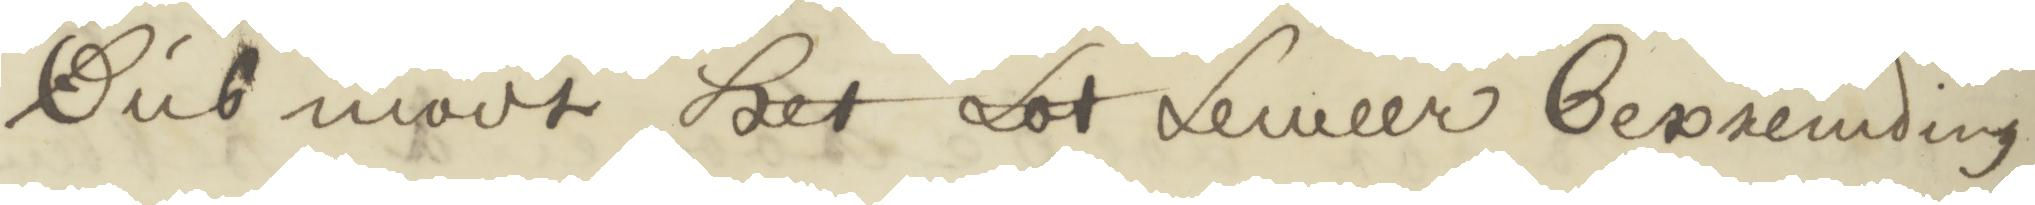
Dus moet het tot temeer bevremding
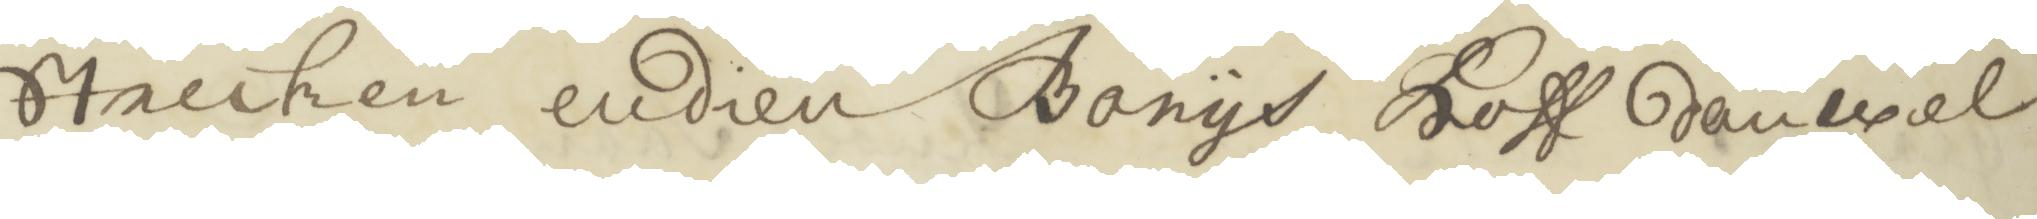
strecken en dien Bonijs Hoff dan wel
